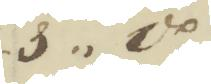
3 „ do
